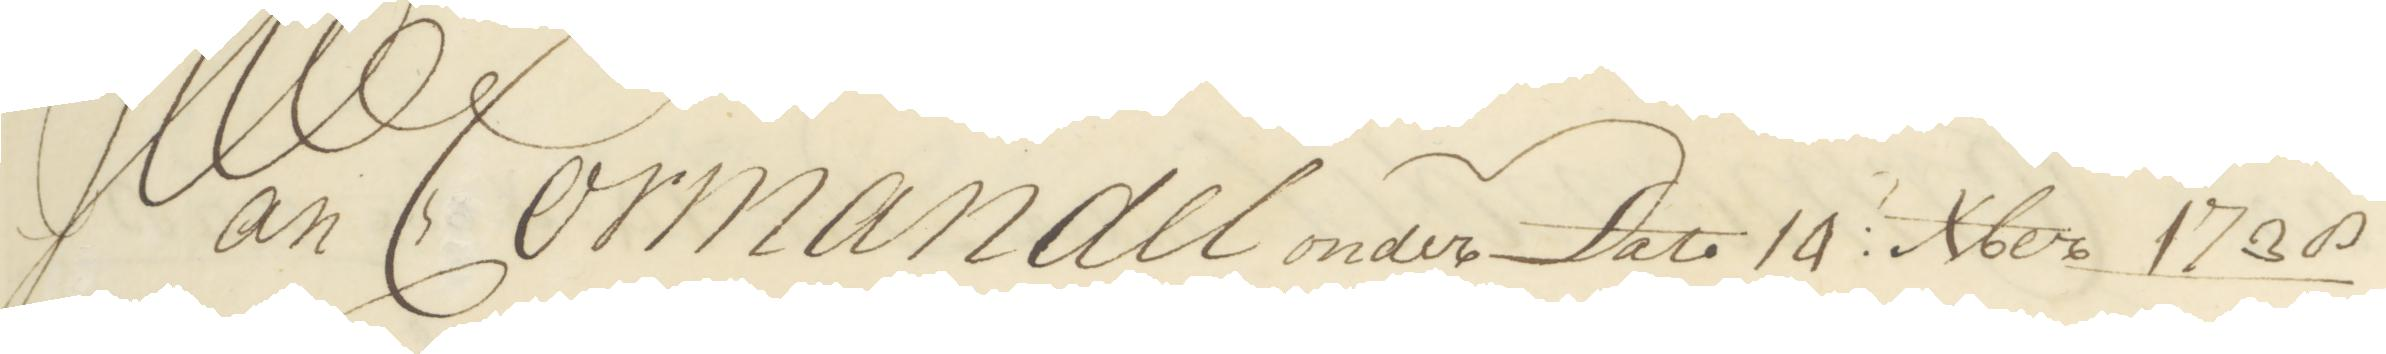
Van Cormandel onder Dato 14:' Xber 1738
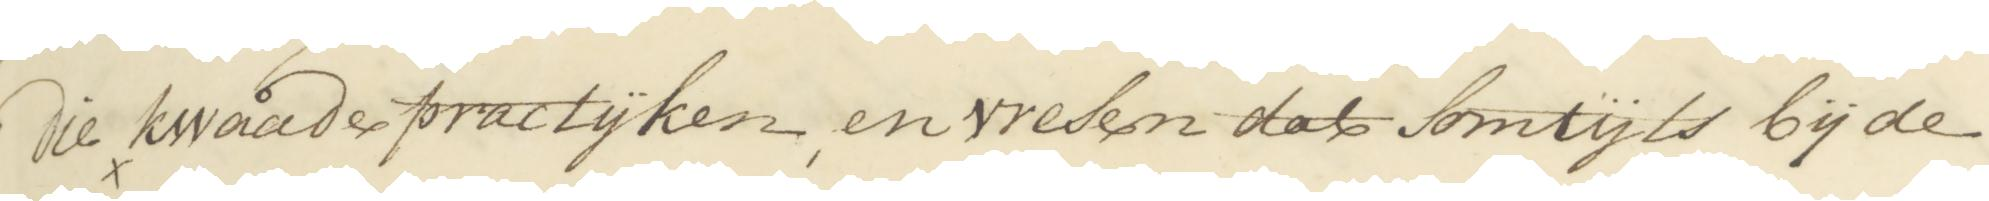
die x kwaade practijken, en vresen dat somtijts bij de
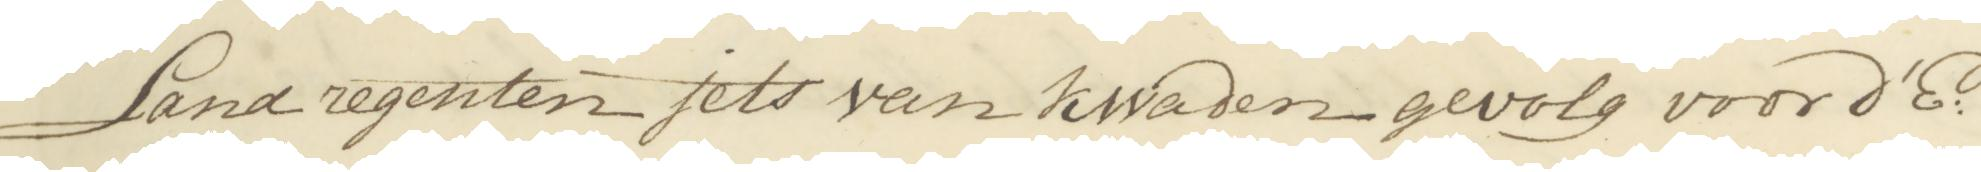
Land regenten jets van kwaden gevolg voor d’ E:
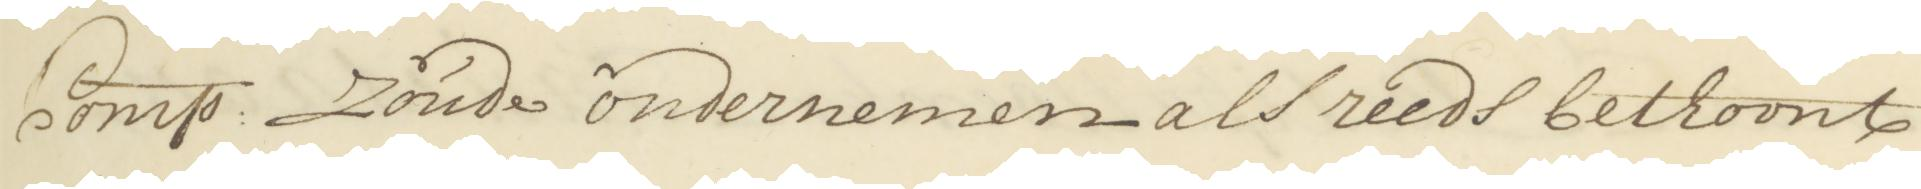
Comp: zoude ondernemen als reeds bethoont
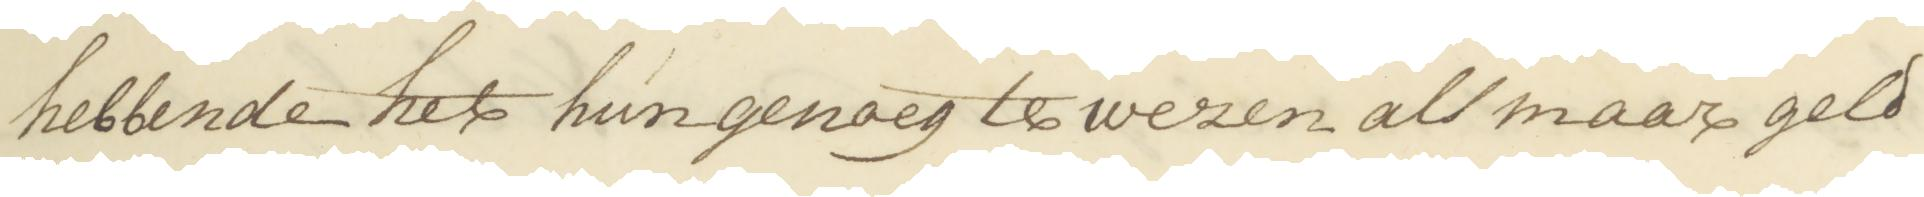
hebbende het hun genoeg te wezen als maar geld
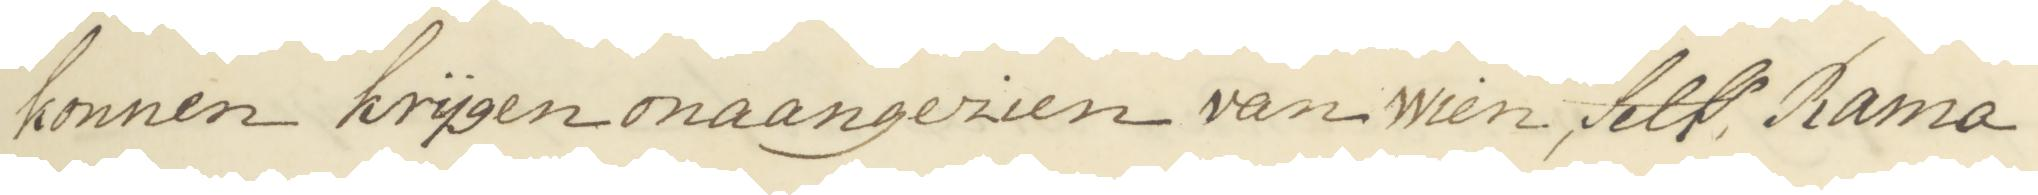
konnen krijgen onaangezien van wien, selfs, Rama
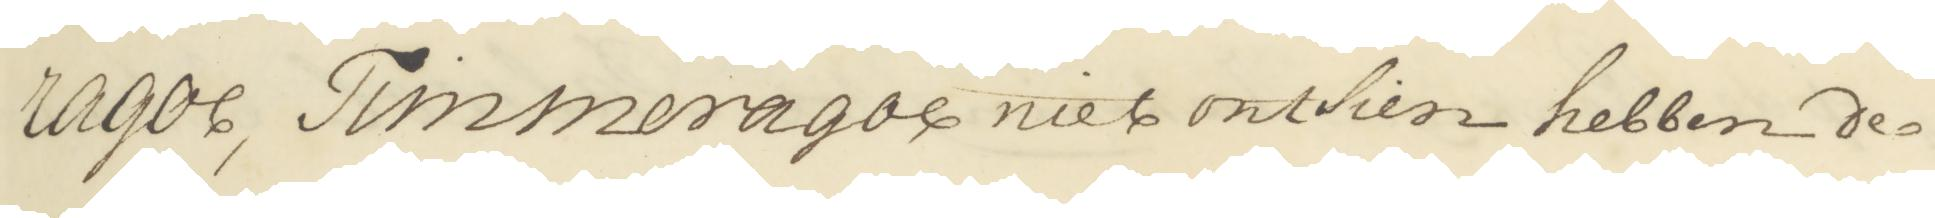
ragoe, Timmeragoe niet ontsien hebben de
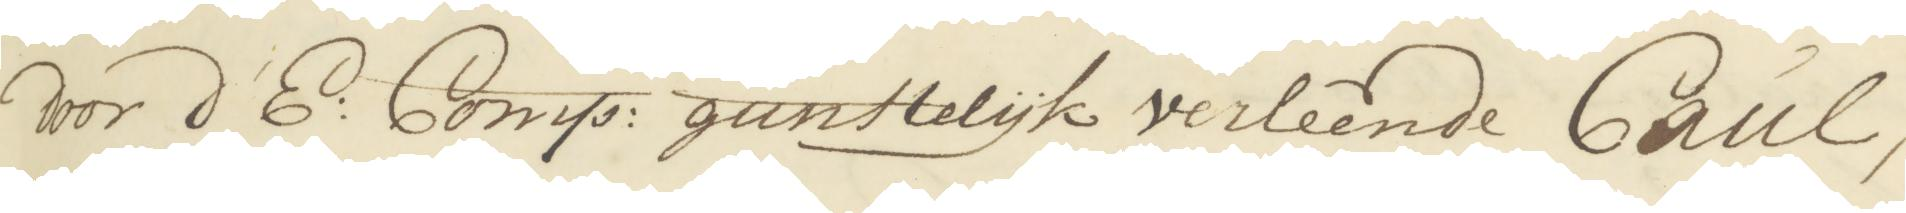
door d’ E: Comp: gunstelijk verleende Caul,
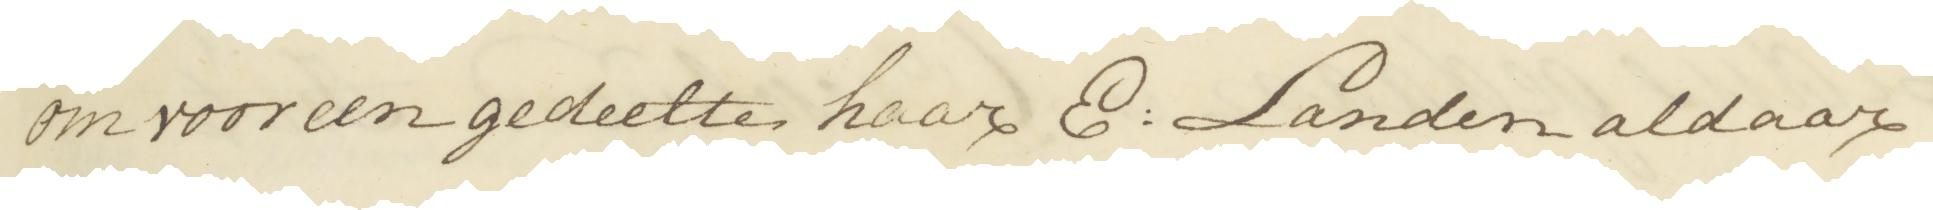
om voor een gedeelte haar E: Landen aldaar
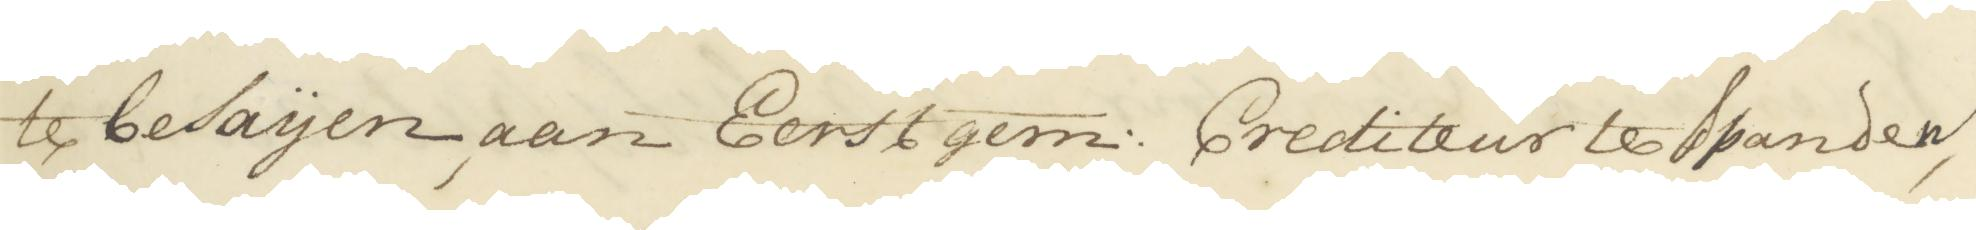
te besaijen, aan Eerst gem: Crediteur te verpanden,
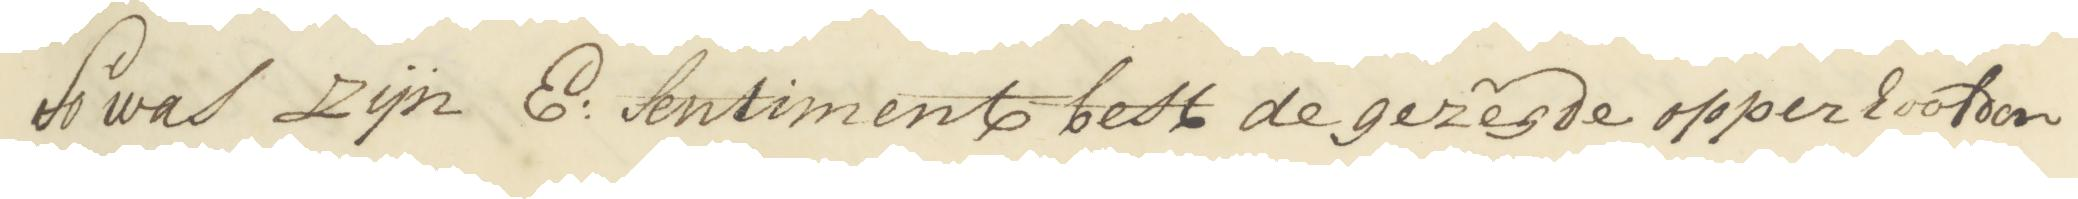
so was zijn E: sentiment best de gezegde opperhoofden
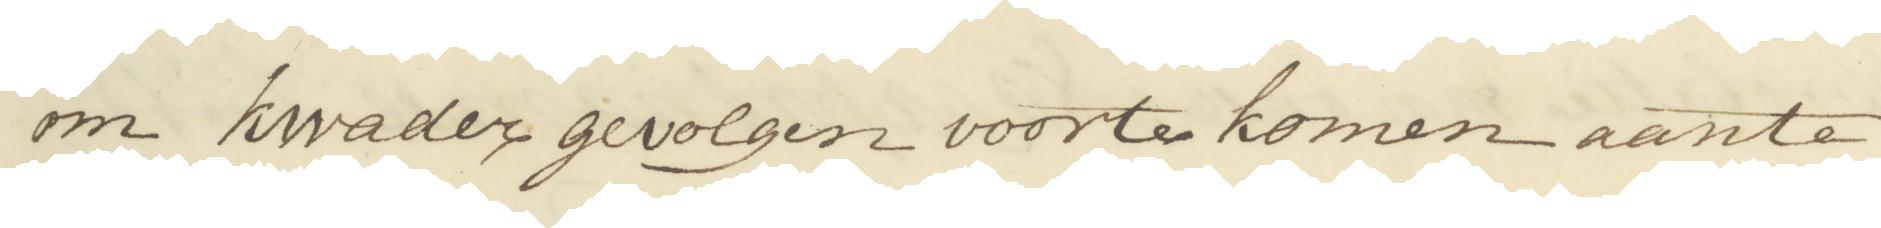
om kwader gevolgen voorte komen aante
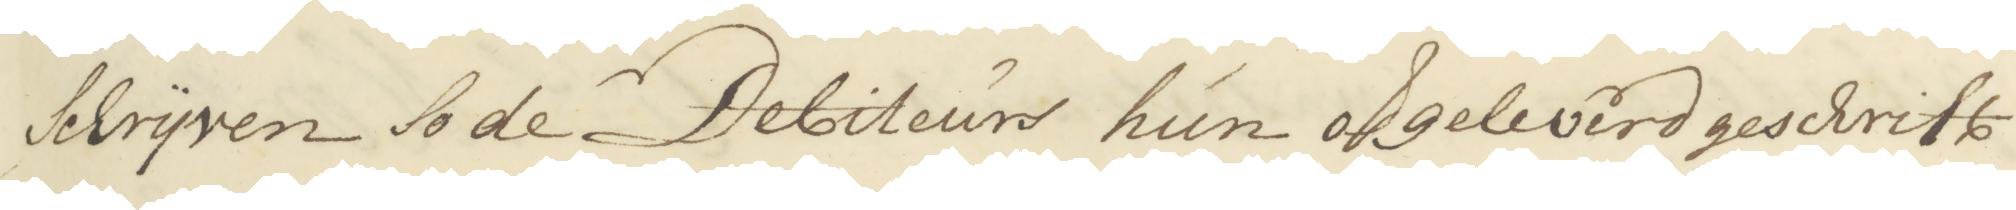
schrijven so de Debiteurs hun overgeleverd geschrift
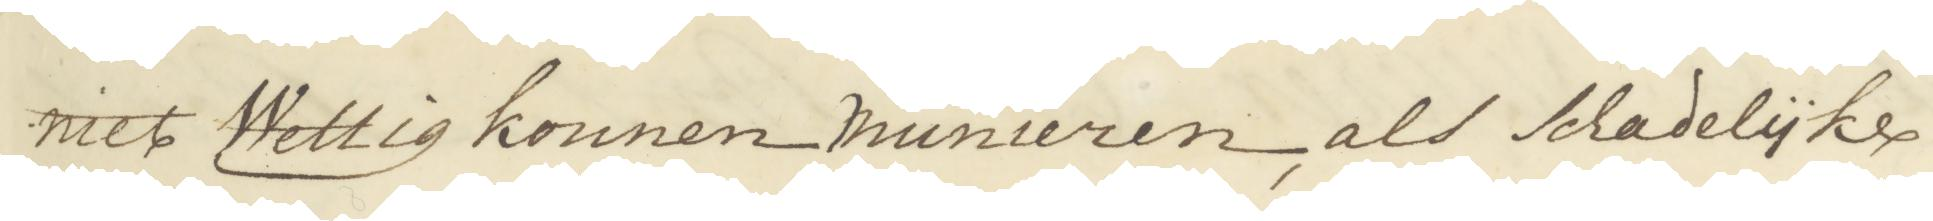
niet Wettig konnen munieren, als schadelijke
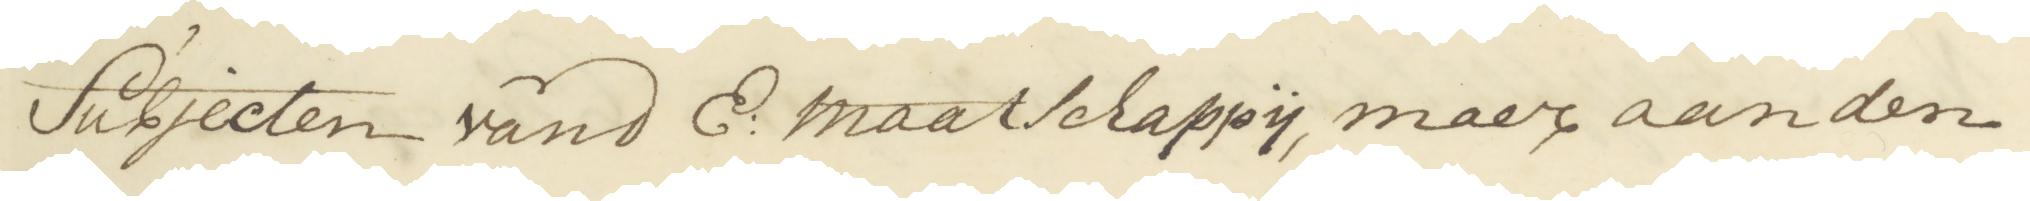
subjecten vand E: maatschappij, maer aan den
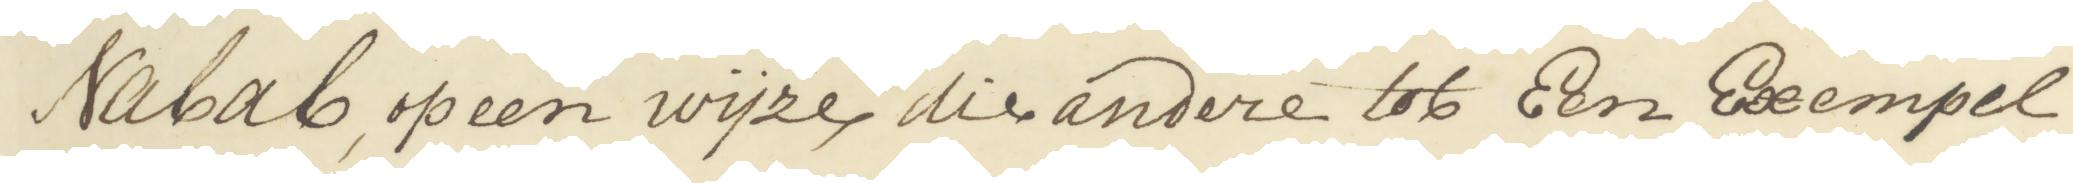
Nabab, op een wijze die andere tot Een Exempel
